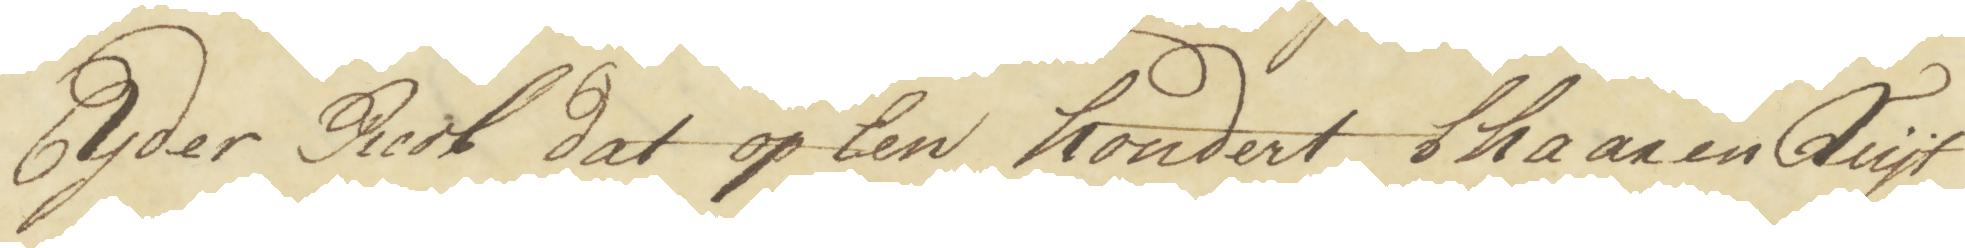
Yder Picol dat op Een hondert bhaaren Uijt
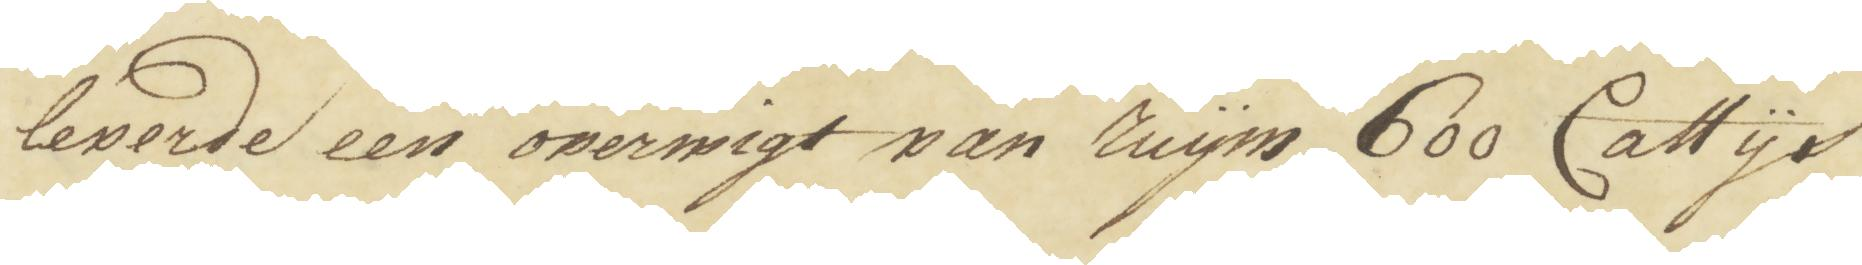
leverde een overwigt van ruijm 600 Cattijs
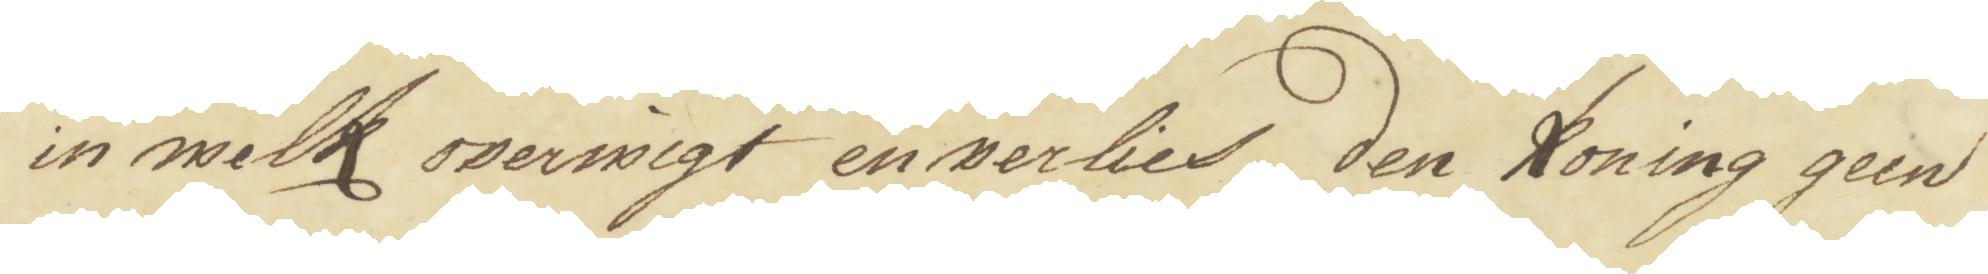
in welk overwigt en verlies den koning geen
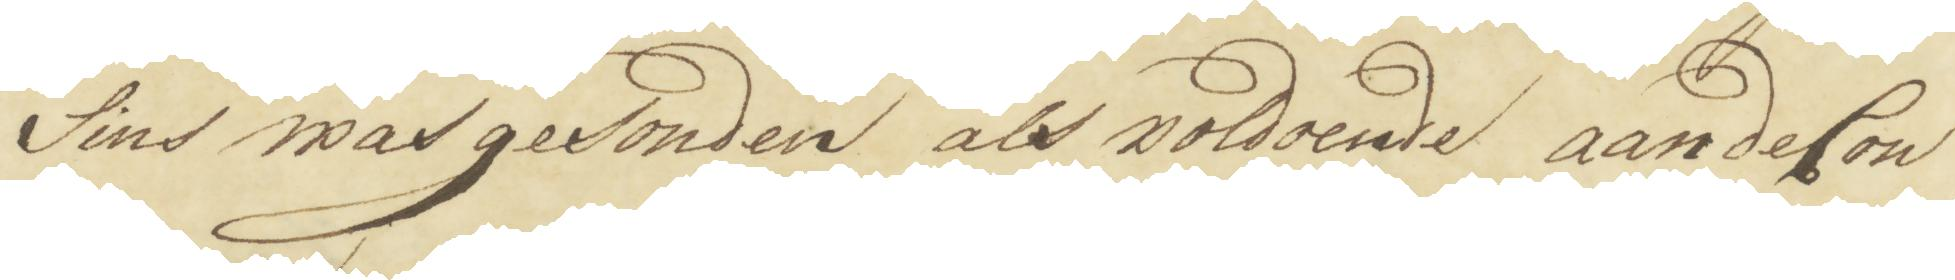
sins was gesonden als voldoende aan de Con
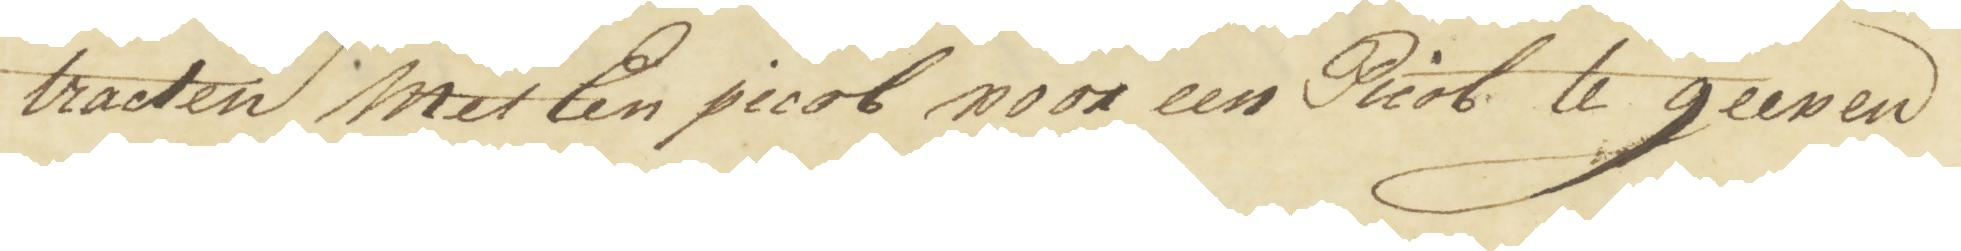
tracten met Een picol voor een Picol. te geeven
